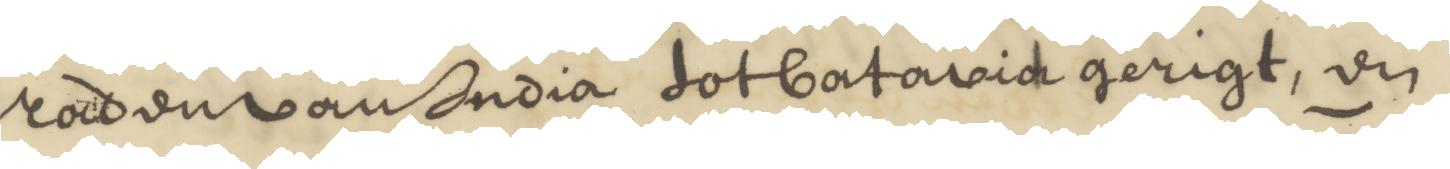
raden van India tot batavia gerigt, en
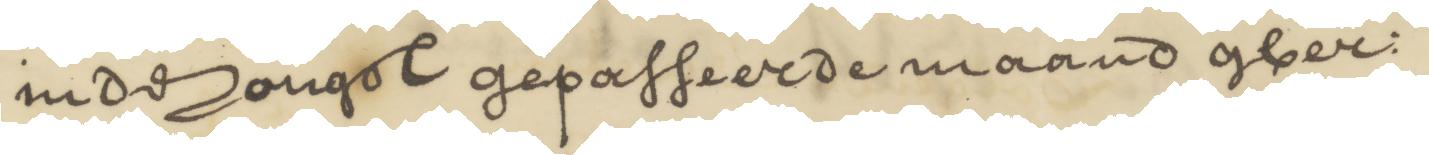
inde Jongst gepasseerde maand 9ber:
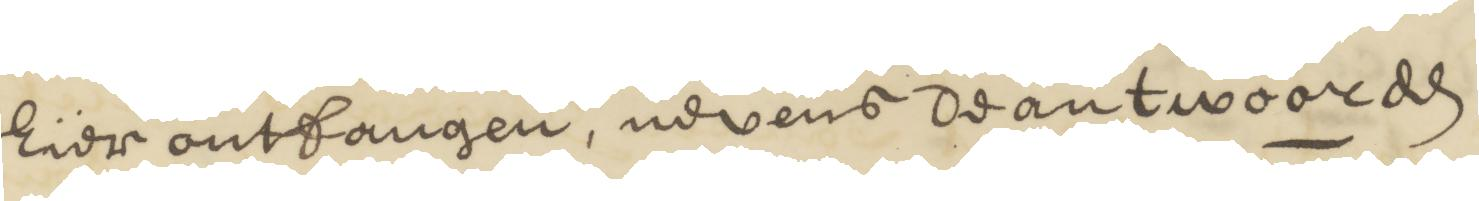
hier ontfangen, nevens de antwoorden
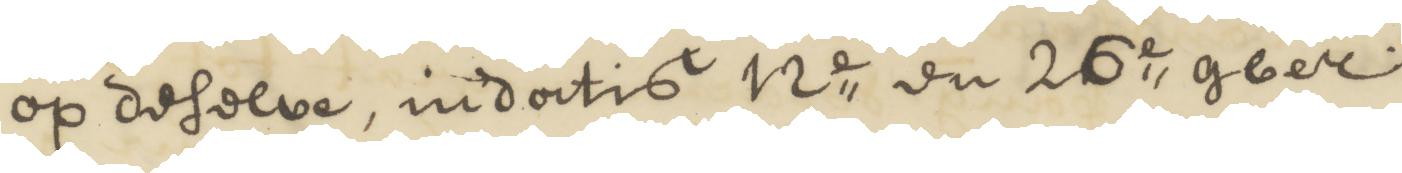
op deselve, in datis 12:e en 26„e 9ber
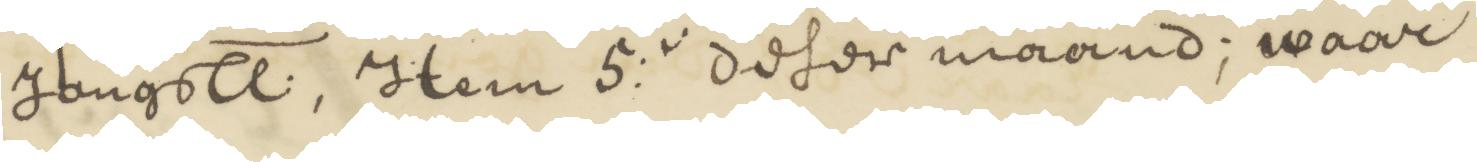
Jongstl:, Item 5:e deser maand; waar
